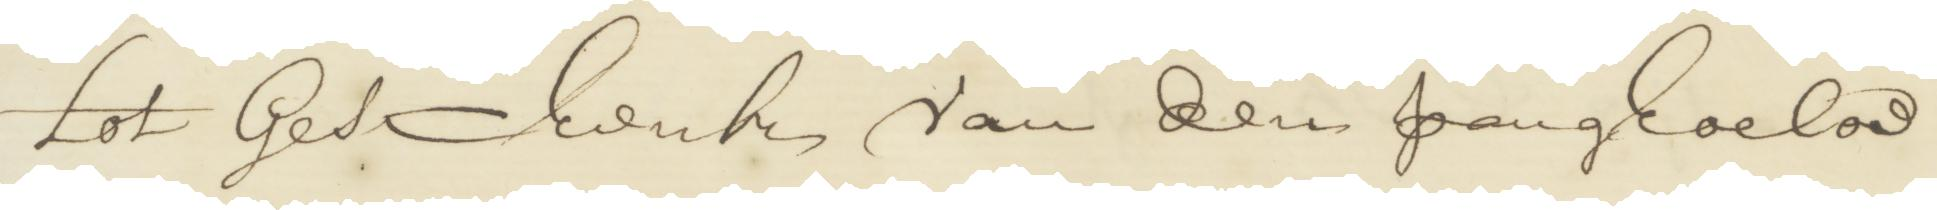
tot Geschenk van den panghoeloe
